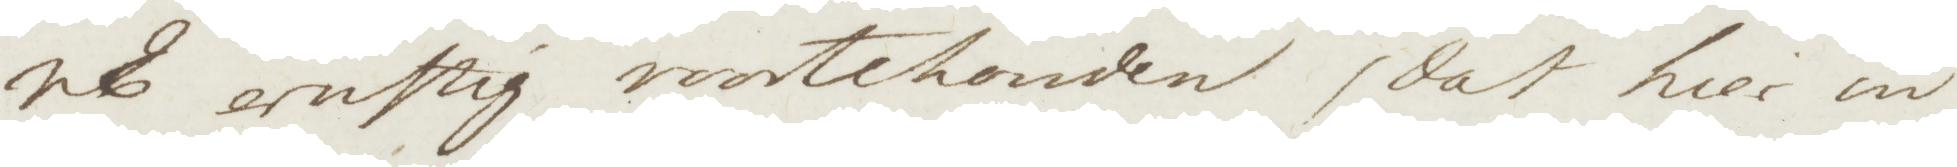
uE ernstig voortehouden /dat hier in
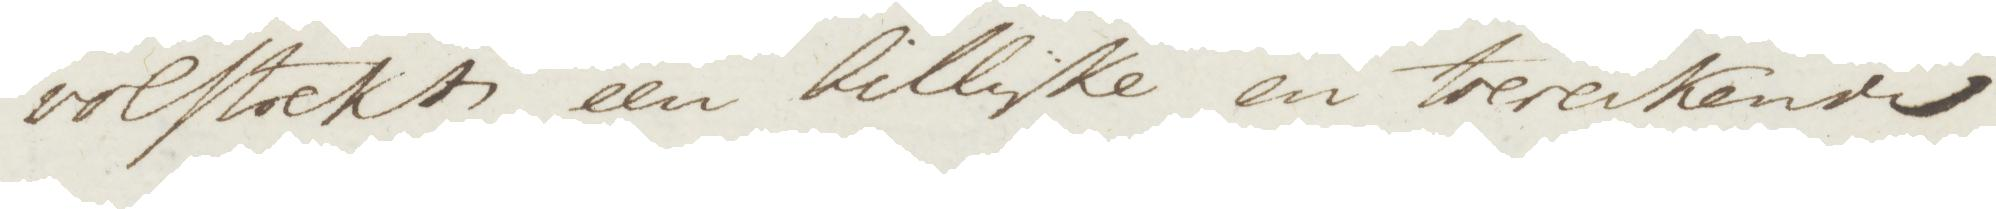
volstrekt een billijke en toereikende
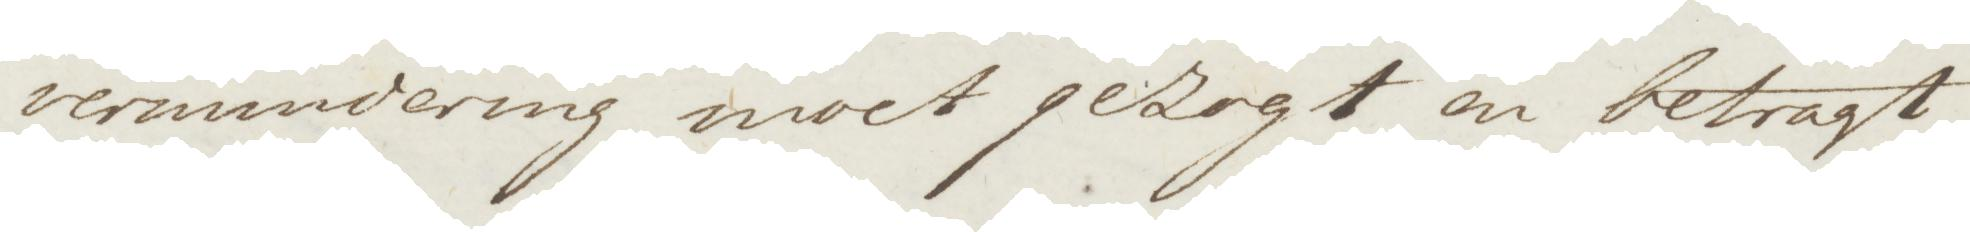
vermindering moet gezogt en betragt
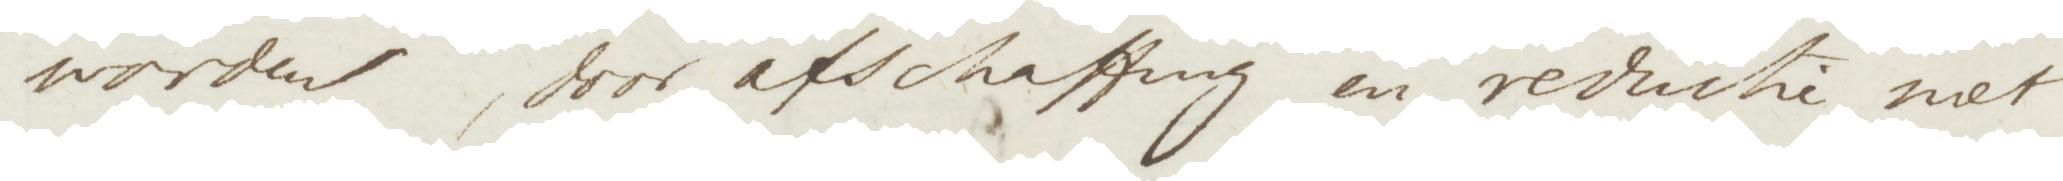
worden , door afschaffing en reductie met
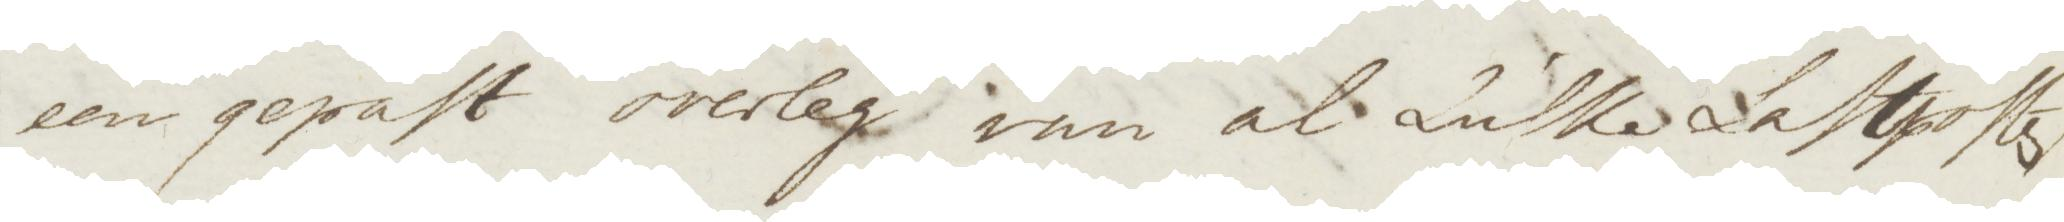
een gepast overleg van al zulke Lastposten
